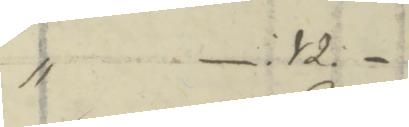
„ —:12:—
